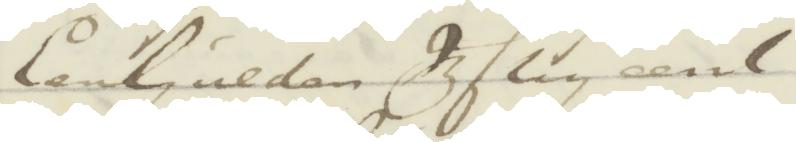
EenGulden Vyftig cent
